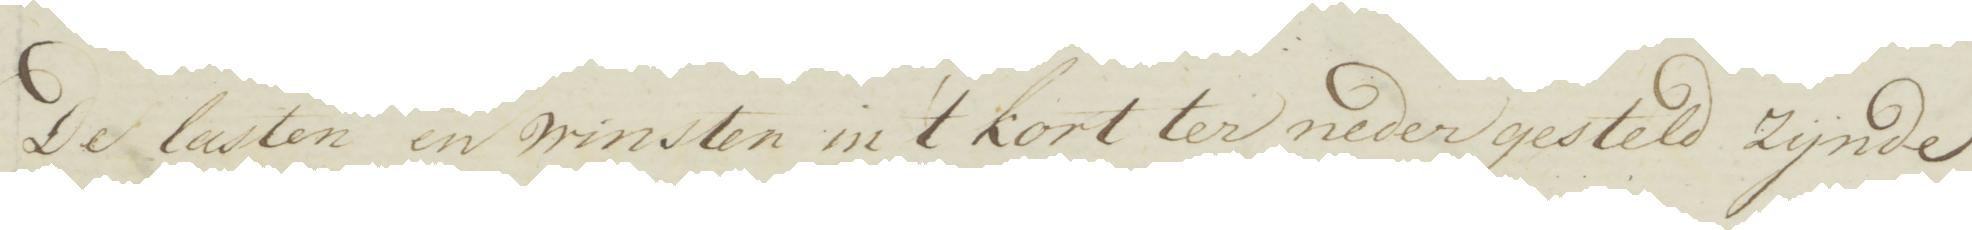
De lasten en winsten in ’t kort ter neder gesteld zijnde
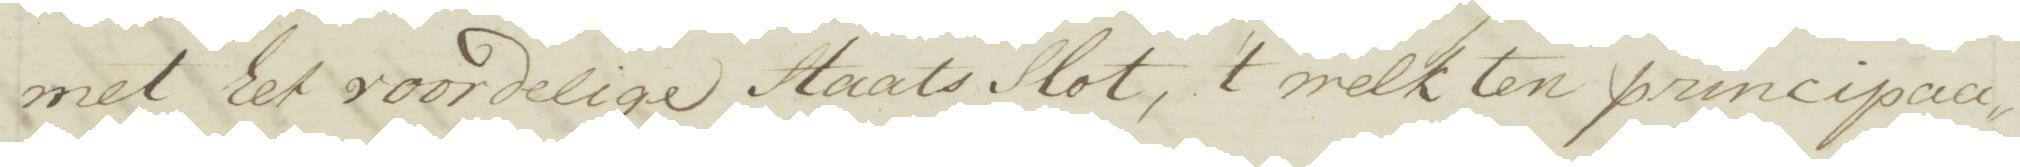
met het voordelige Staats slot, ’t welk ten principaa„
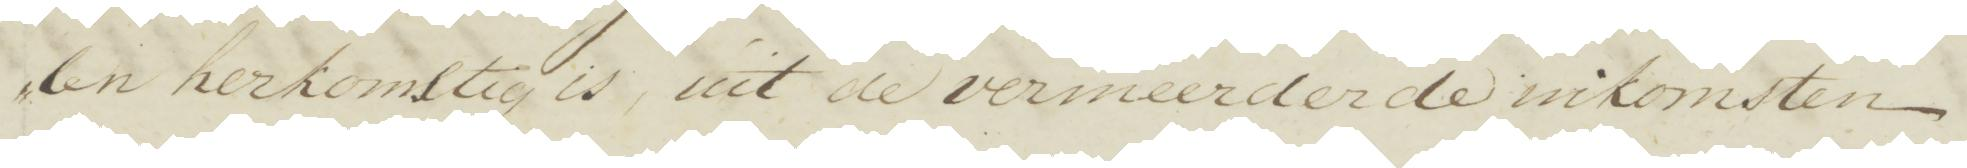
„len herkomst is, uit de vermeerder de inkomsten
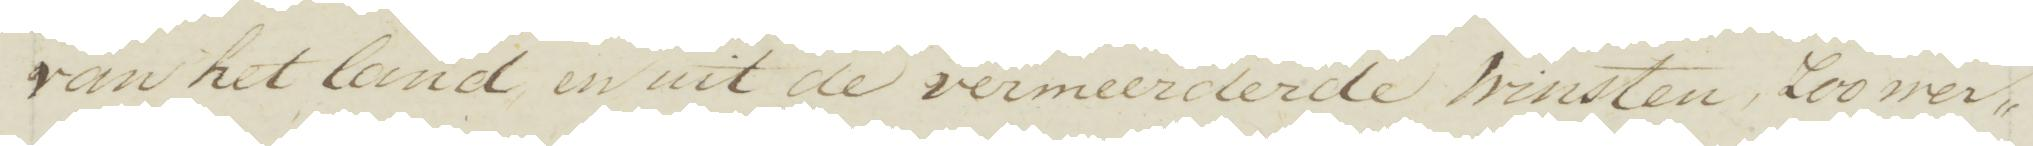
van het land, en uit de vermeerderde Winsten, Zoo wer„
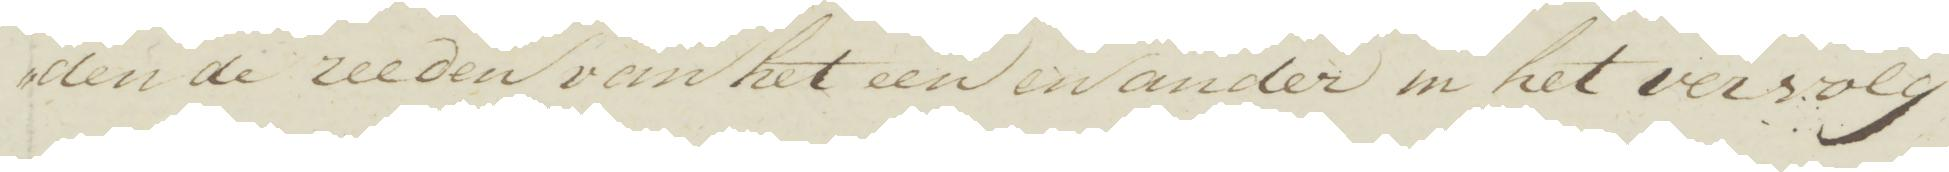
den de reeden van het een en ander in het vervolg
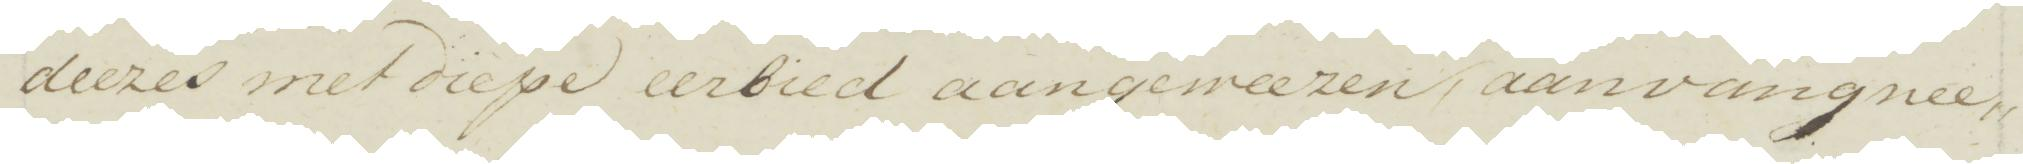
deezes met diepe eerbied aangeweeren, aanvang nee„
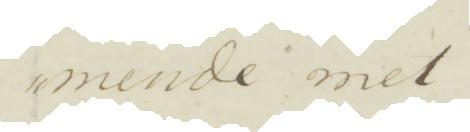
„mende met
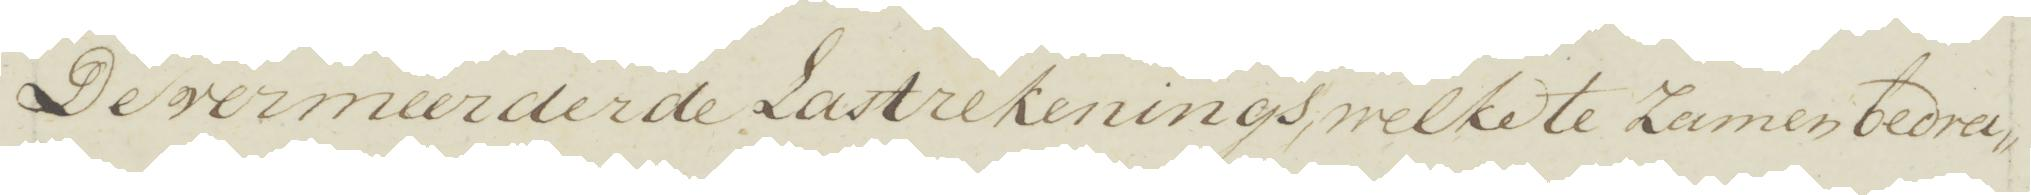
De vermeerderde Lastrekenings, welke te Zamen bedra„
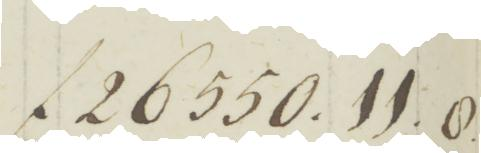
ƒ26350.11: 8.
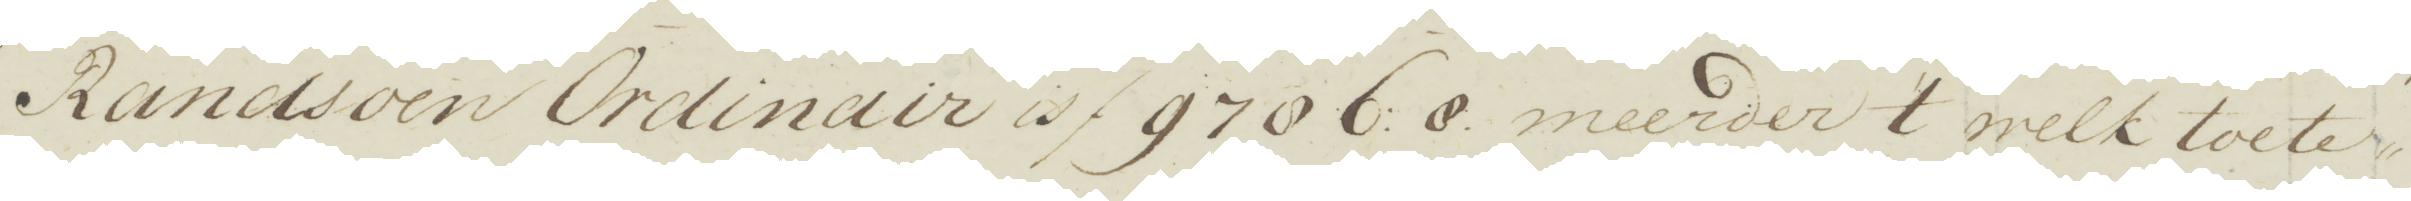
Randsoen Ordinair is ƒ 978 6: 8: meerder 't welk toe te„
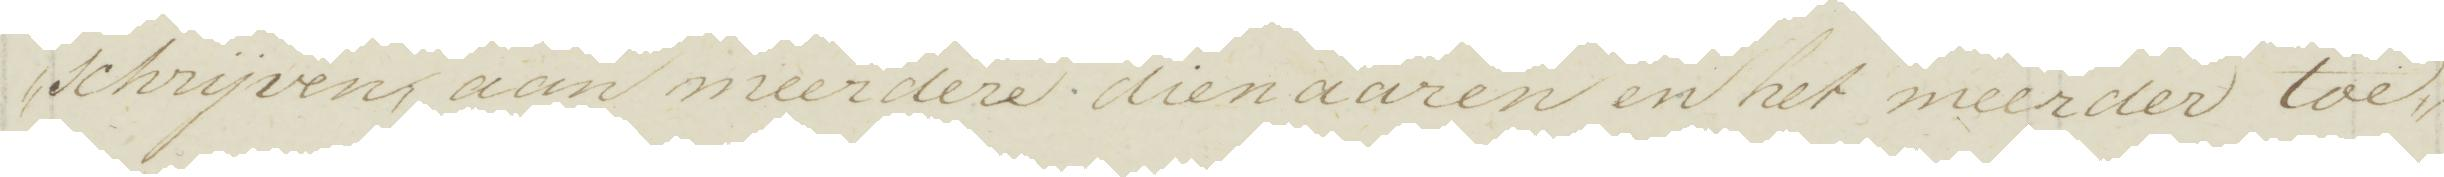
„schrijven, aan meerdere dienaaren en het meerder toe„
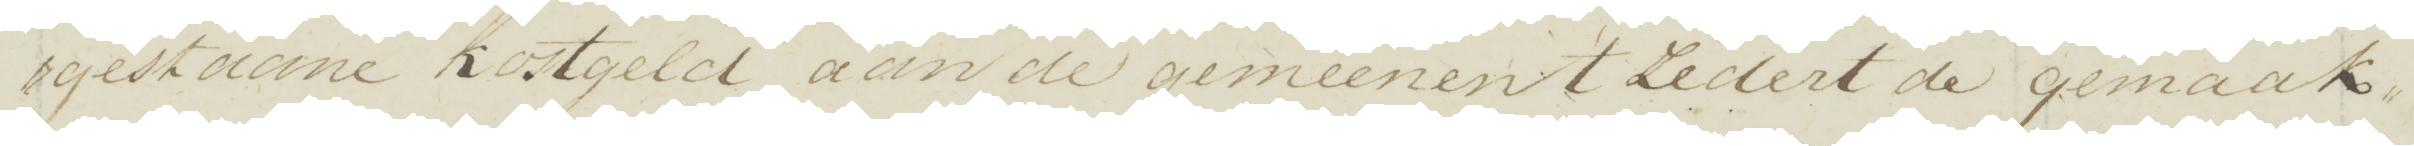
„gestaane kostgeld aan de gemeenen 't zedert de gemaak„
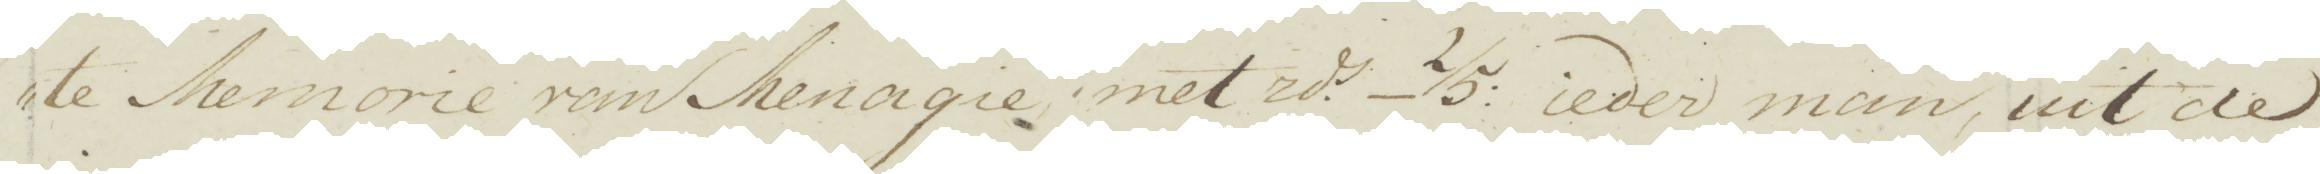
„te Memorie van Menagie, met rd.s - 2/5: ieder man, uit de
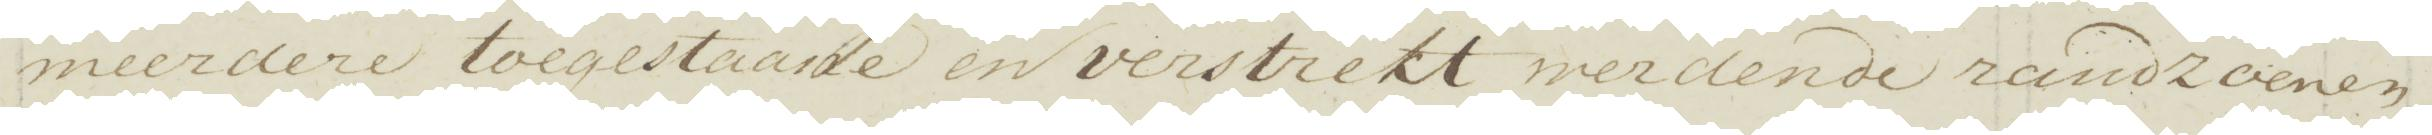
meerdere toegestaane en verstrekt werdende randzoenen
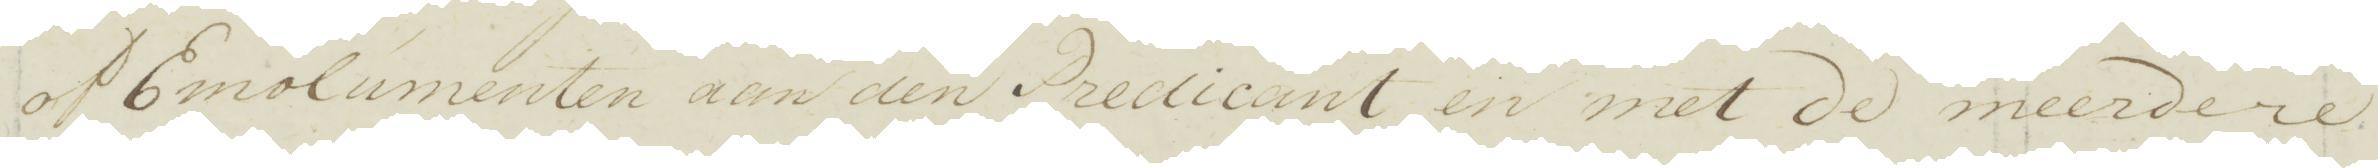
of Emolumenten aan den Predicant en met de meerdere.
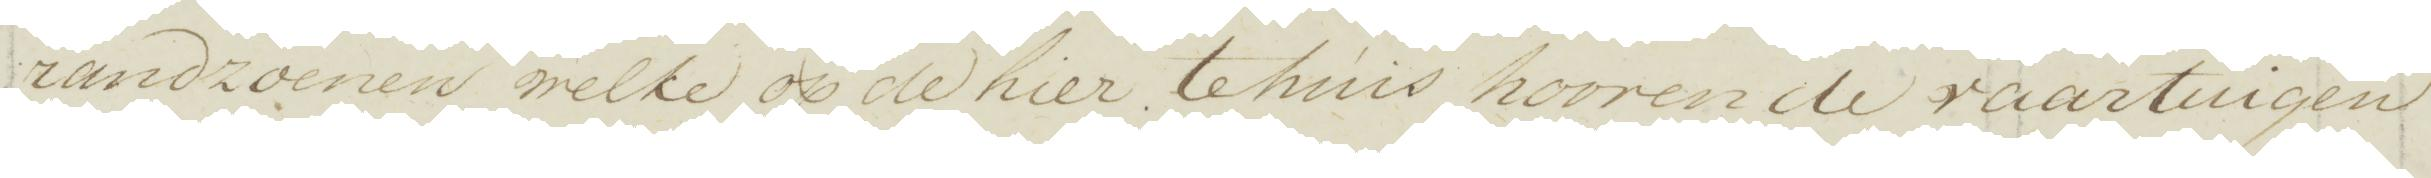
randzoenen welke op de hier te huis hoorende vaartuigen
